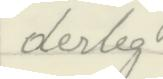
derteg
